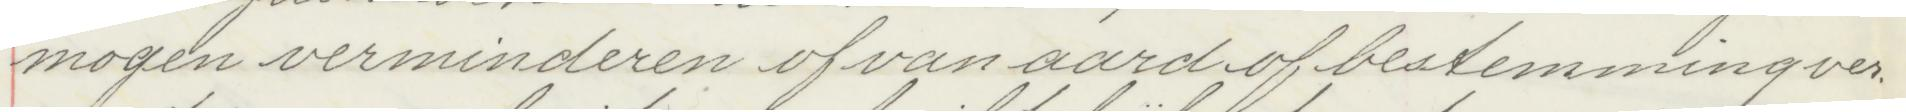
mogen verminderen of van aard of bestemming ver,
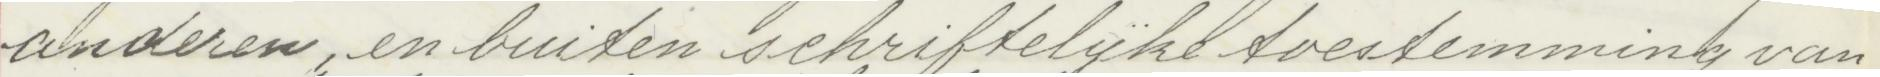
anderen, en buiten schriftelijke toestemming van
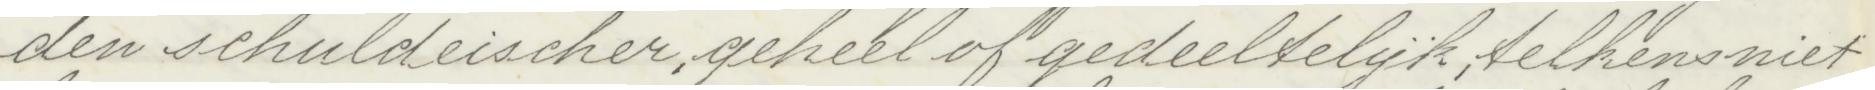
den schuldeischer, geheel of gedeeltelijk, telkens niet
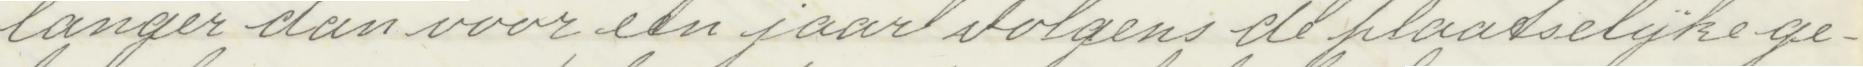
langer dan voor een jaar volgens de plaatselijke ge-
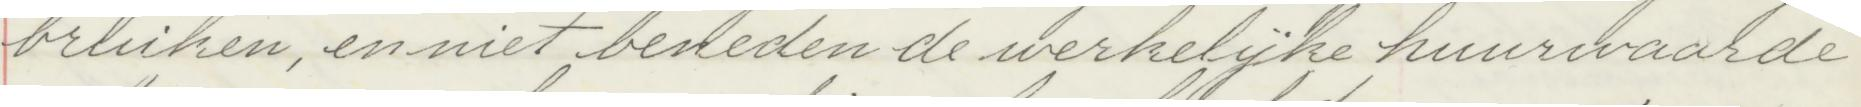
bruiken, en niet beneden de werkelijke huurwaarde
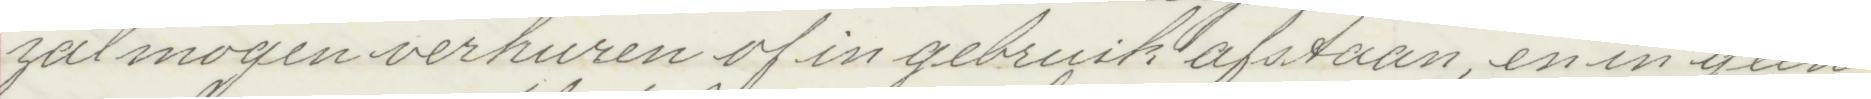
zal mogen verhuren of in gebruik afstaan, en in geen
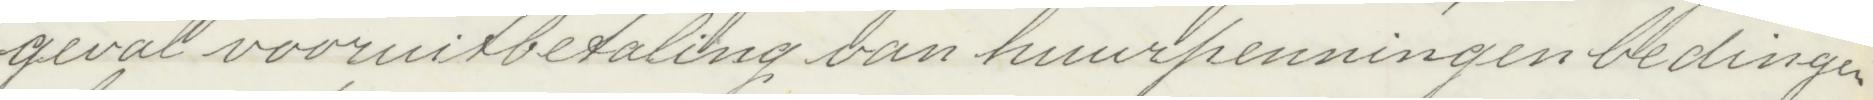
geval vooruitbetaling van huurpenningen bedingen
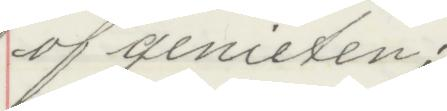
of genieten.
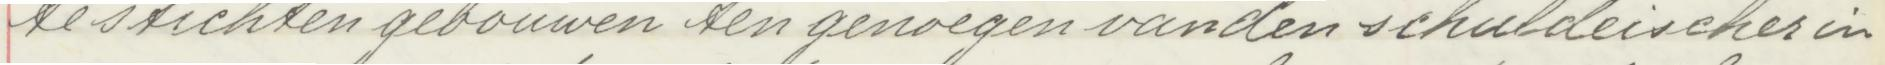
te stichten gebouwen ten genoegen van den schuldeischer in
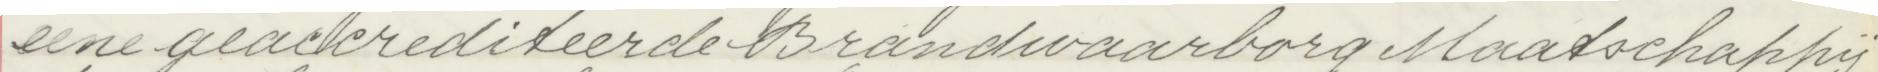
eene geaccrediteerde Brandwaarborg Maatschappij
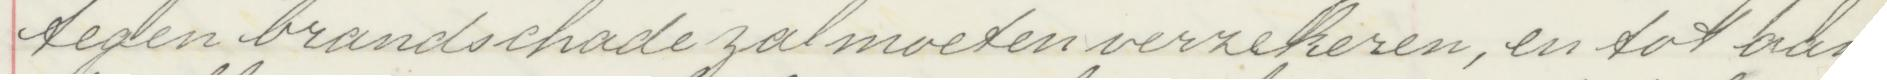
tegen brandschade zal moeten verzekeren, en tot aan
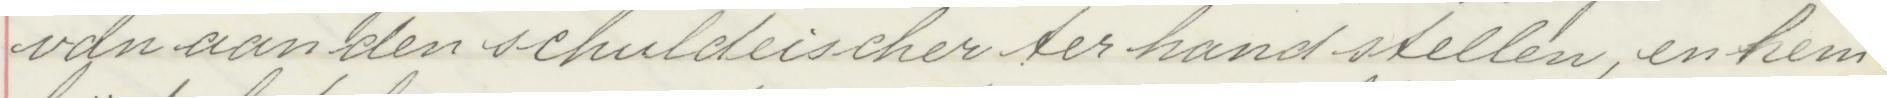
van aan den schuldeischer ter hand stellen, en hem
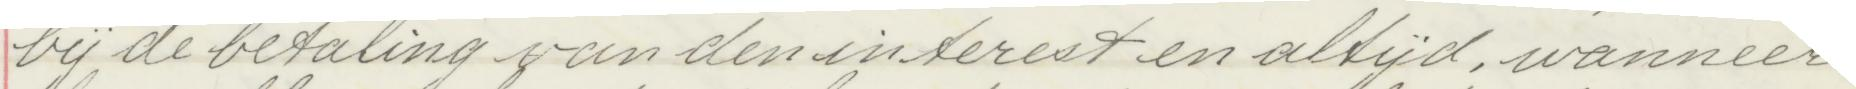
bij de betaling van den interest en altijd, wanneer
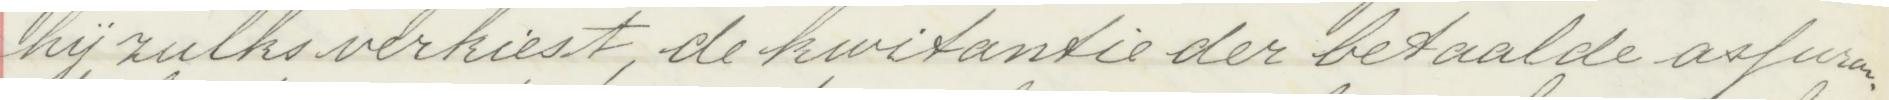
hij zulks verkiest, de kwitantie der betaalde assura„
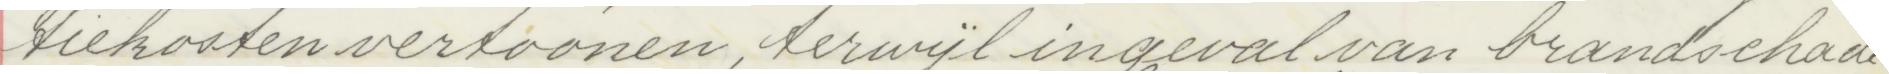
tiekosten vertoonen, terwijl ingeval van brandschade
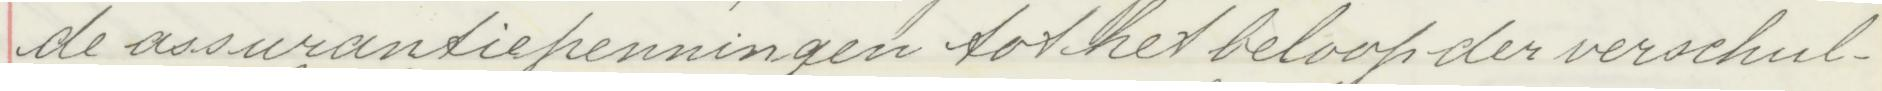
de assurantiepenningen tot het beloop der verschul-
